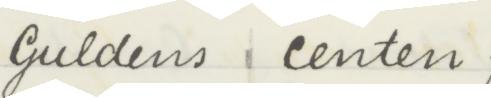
Guldens centen
